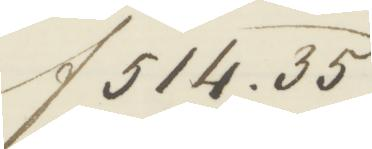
ƒ 514.35
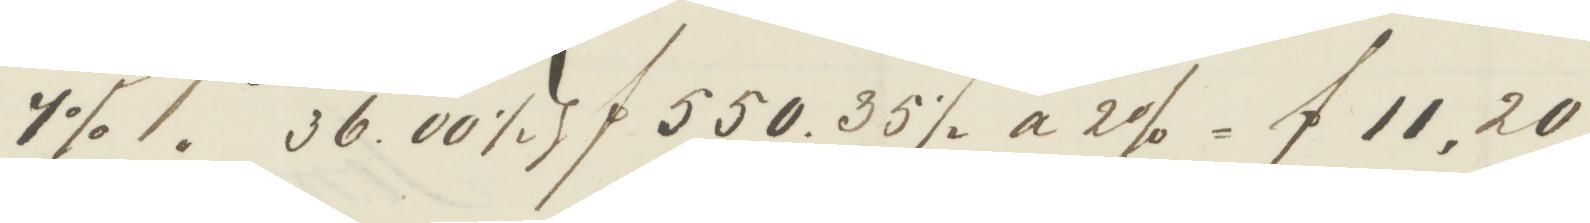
7% „ 36.00½ ƒ550.35½ a 2% - ƒ 11,20
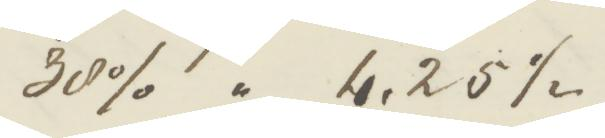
38% „ 4.25½
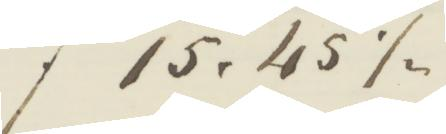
ƒ 15, 45½
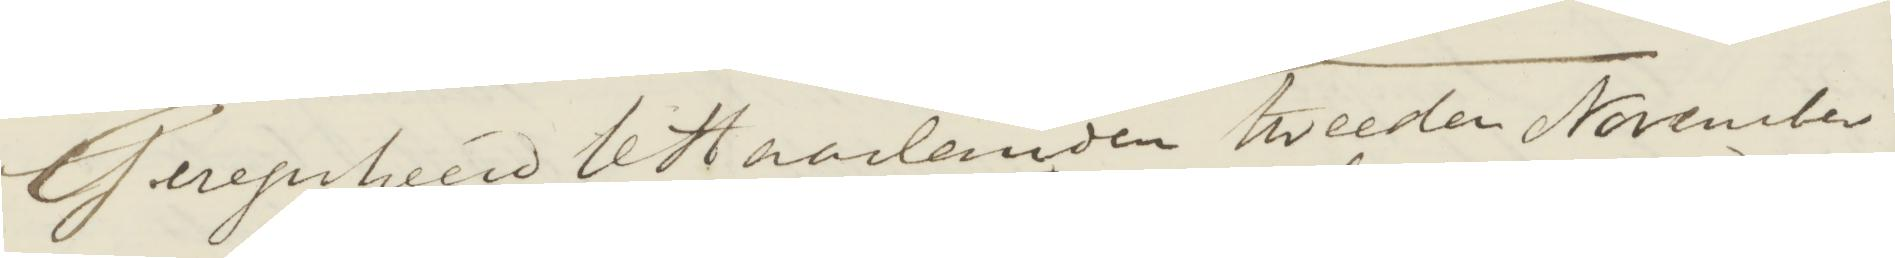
Geregistreerd te Haarlem den tweeden November
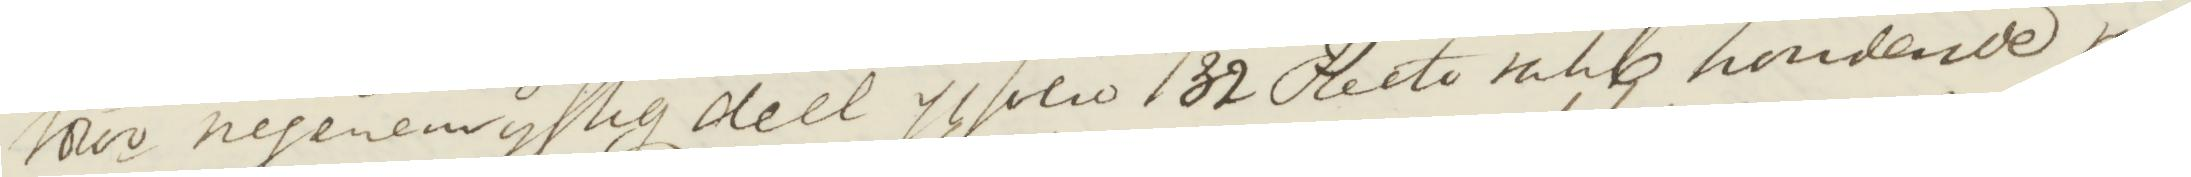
1800 negenenvyftig deel 71 folio 132 Recto vak C houdende vier
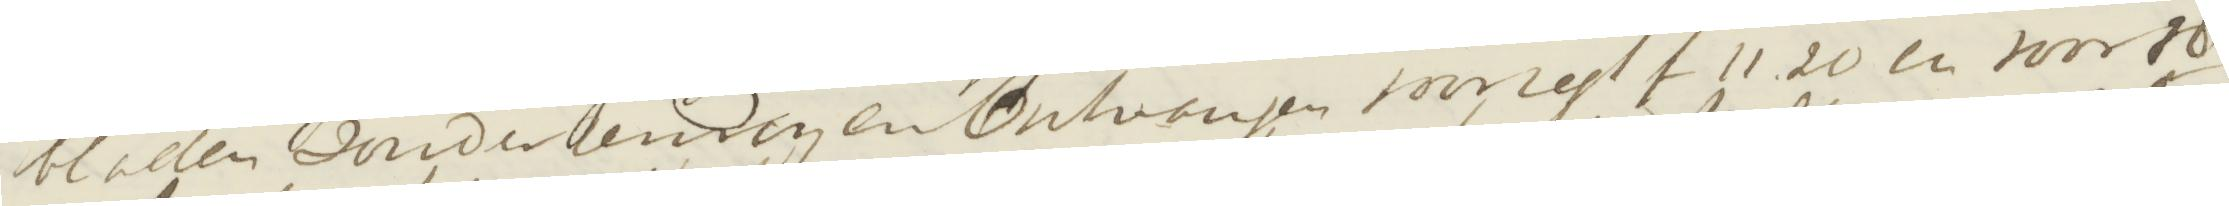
bladen zonder lening en Ontvangen voor regt ƒ 11. 20 en voor 18
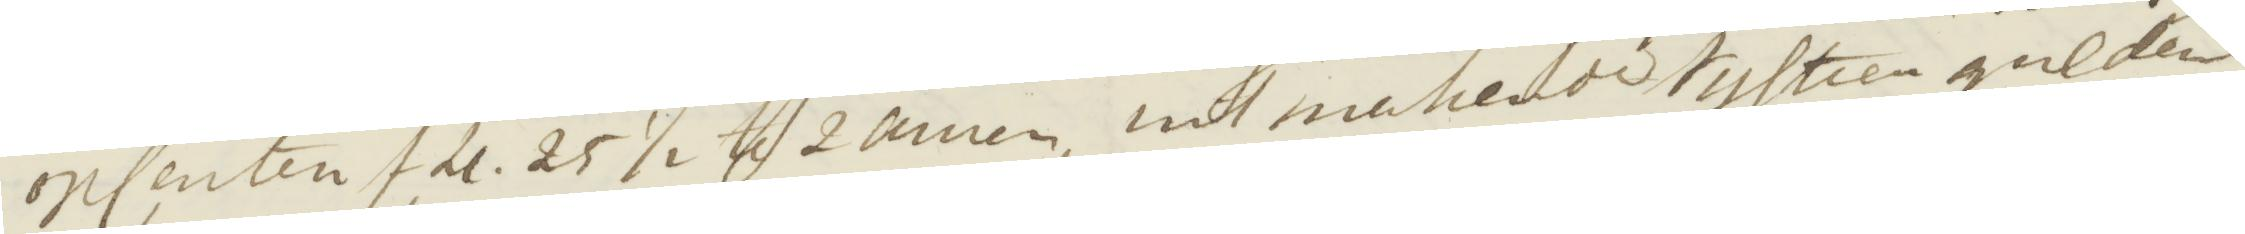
opcenten ƒ4.25½ te zamen uitmakende Vyftien gulden
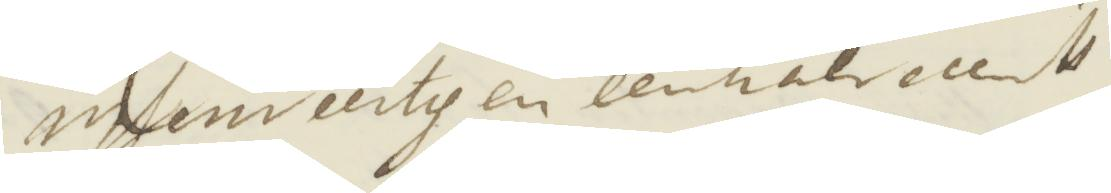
vyfenveertig en een halve cent
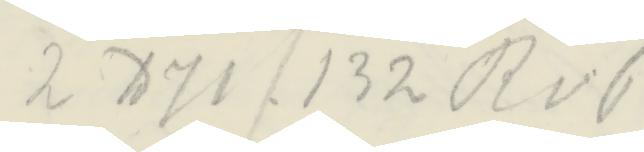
2 D71 ƒ 132 Rv6
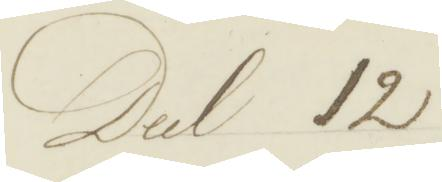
Deel 12
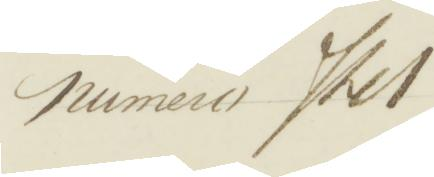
Numero 741
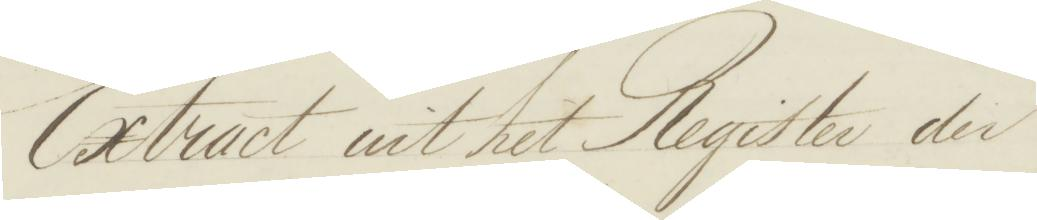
Extract uit het Register der
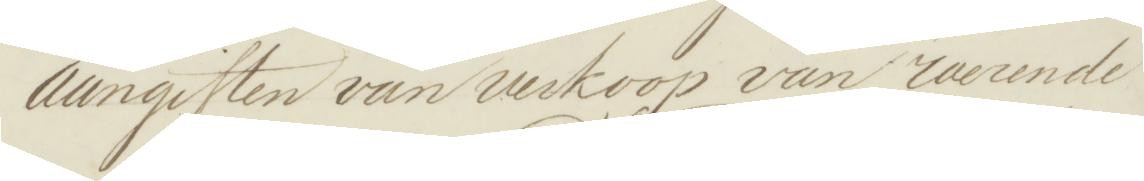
Aangiften van verkoop van roerende
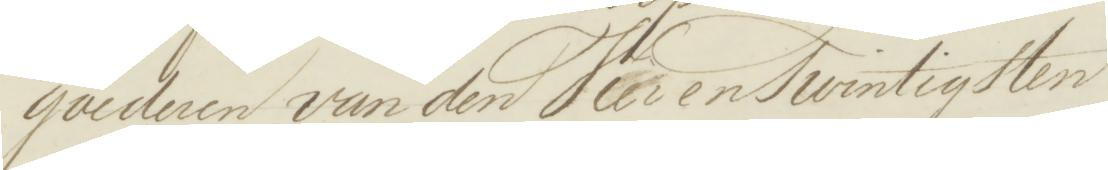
goederen van den Vier en Twintigsten
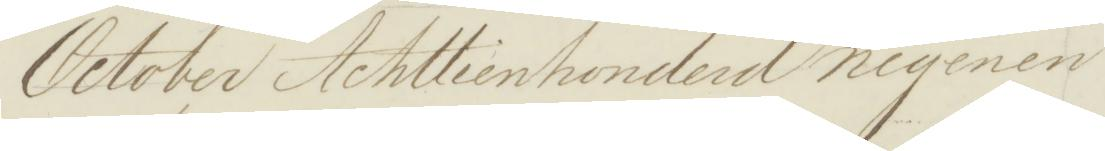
October Achttienhonderd negenen
